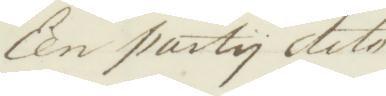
Een partij dito
